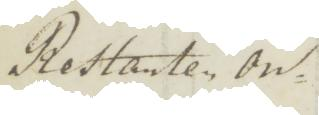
Restanten on„
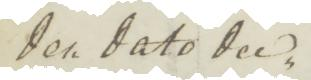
der dato dee„
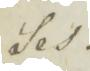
Ses.
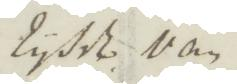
Eijsch: van
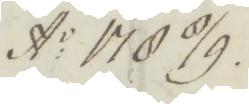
A:o 178 8/9.
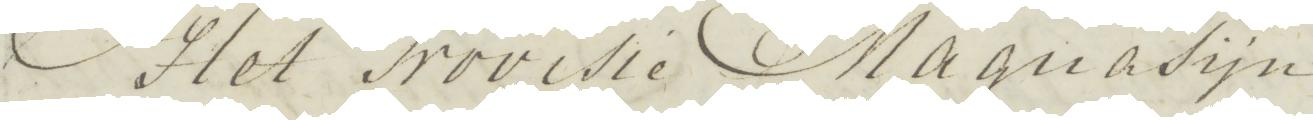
Het Provisie Maguasijn
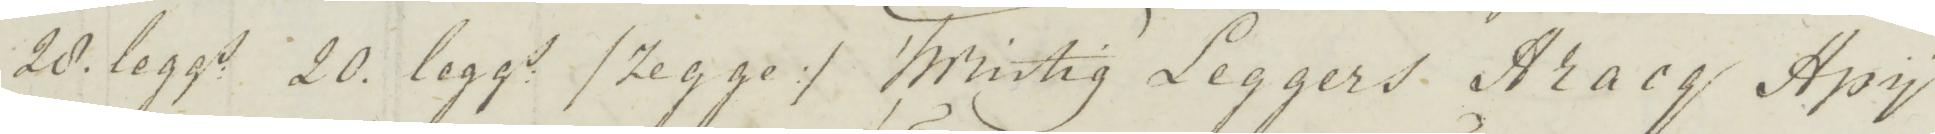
28. legg:s 20. legg:s /zegge:/ Twintig Leggers Aracq Apij
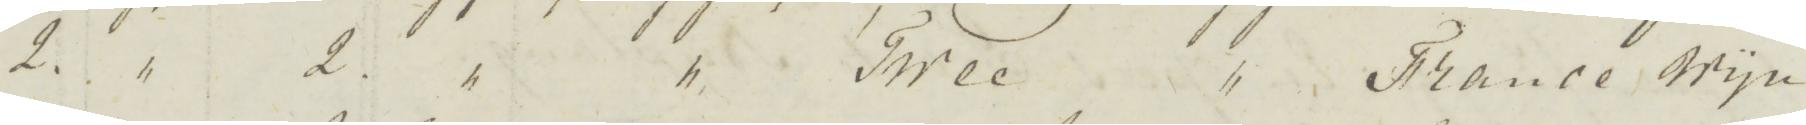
2. „ 2. „ „ Twee „ France Wijn
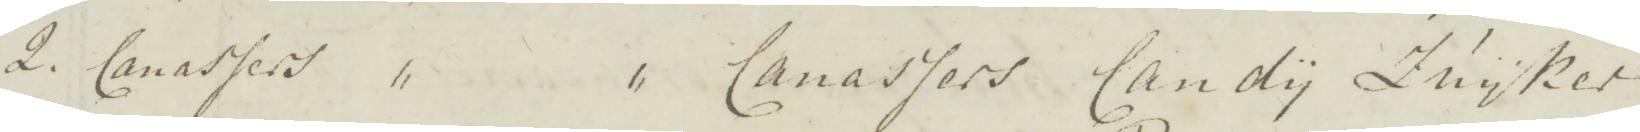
2. Canassers „ „ Canassers Candij Zuijker
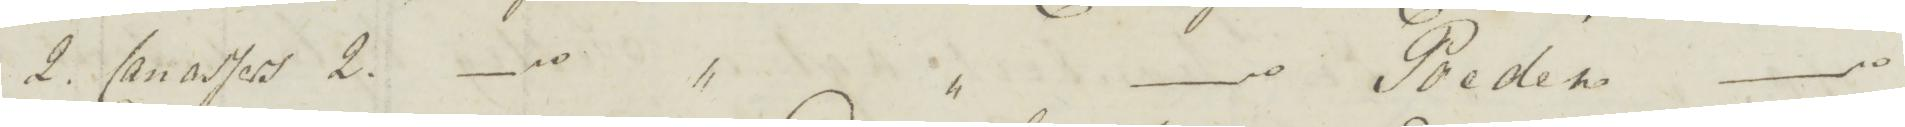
2. Canassers 2. —:o „ „ —:o Poeder —:o
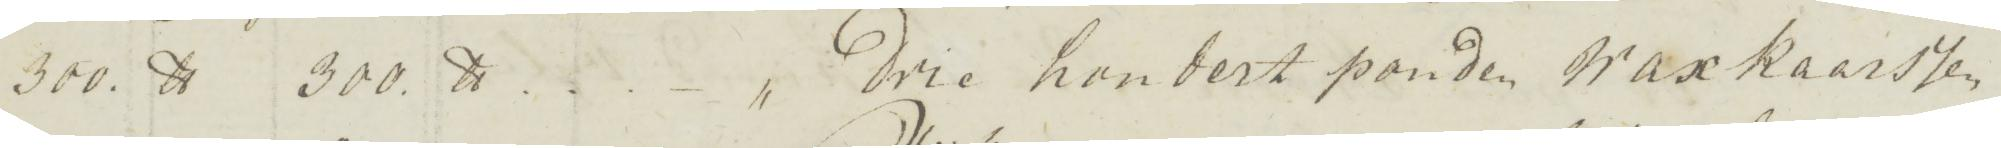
300. lb 300. lb . . . - „ drie hondert ponden Wax kaarssen
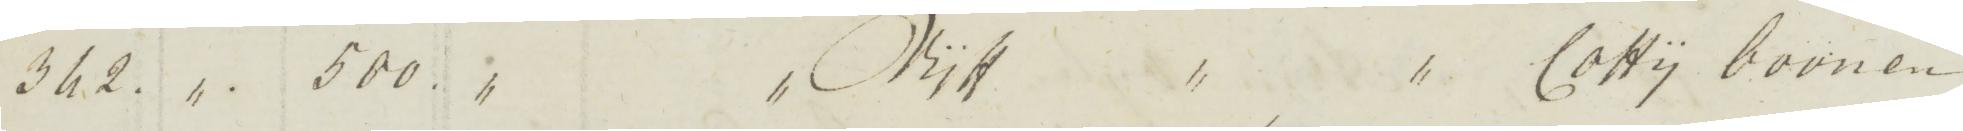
342. „ 500. „ „ Vijff „ „ Coffij boonen
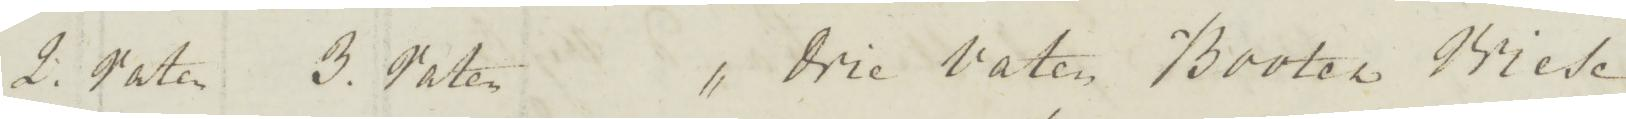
2: Vaten 3. Vaten „ drie vaten Booter Vriese
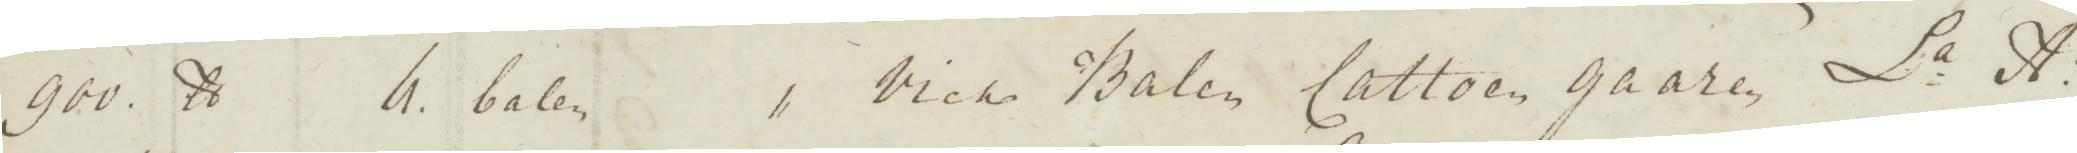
900. lb 4. balen „ vier Balen Cattoen gaaren L:a A:
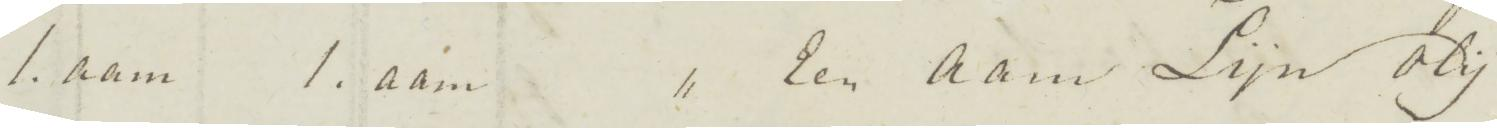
1. aam 1. aam „ Een aam Lijn olij
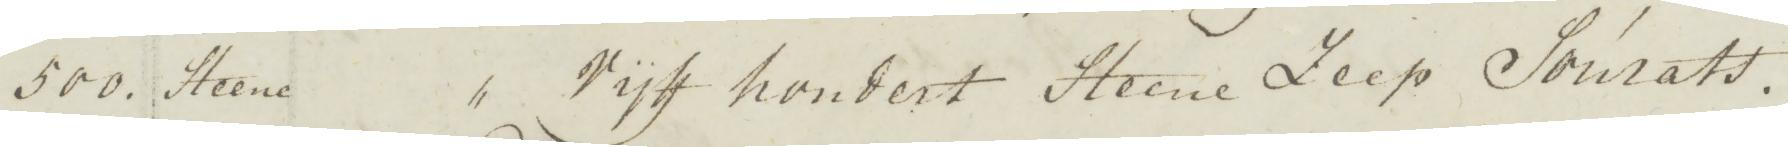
500. Steene „ Vijff hondert Steene Zeep Sourats.
